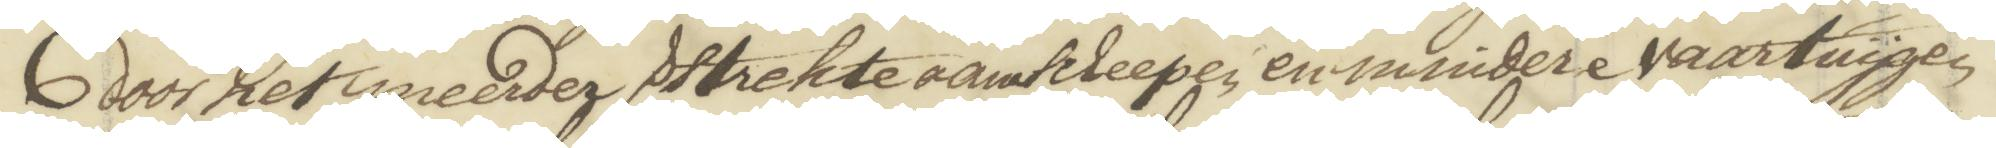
door het meerder verstrekte aanscheepen en mindere vaartuijgen
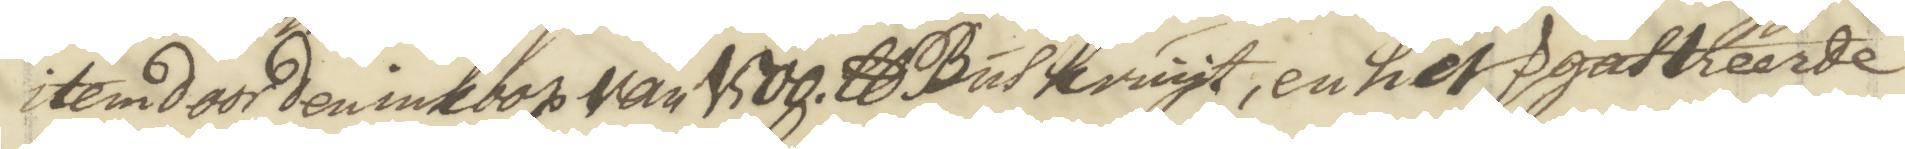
item door den inkoop van 1500. lb Bus kruijt, en het vergastreerde
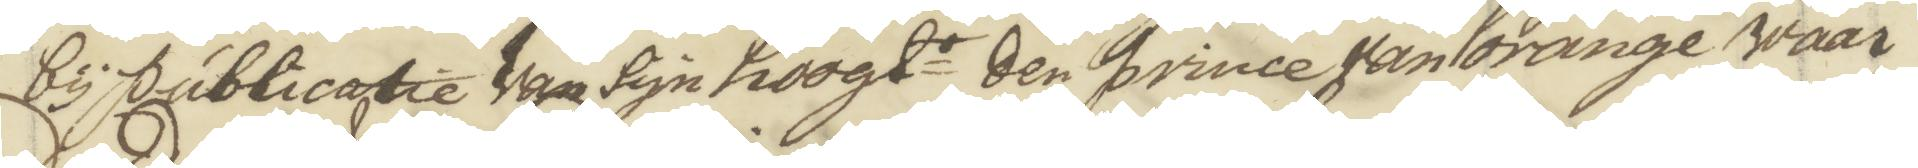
bij publicatie van sijn hoogh=t den Prince van orange Waar
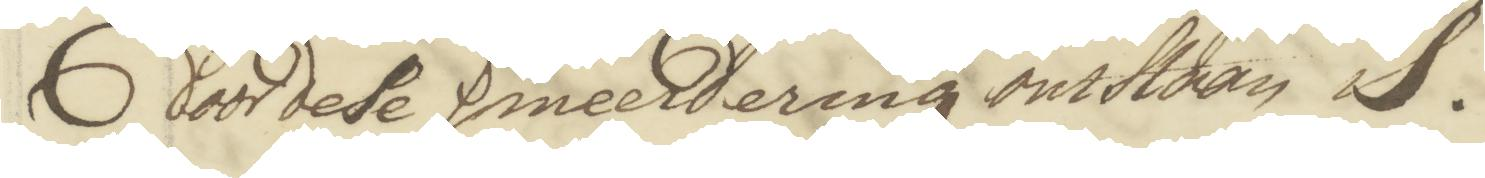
door dese vermeerdering ontstaan is.
